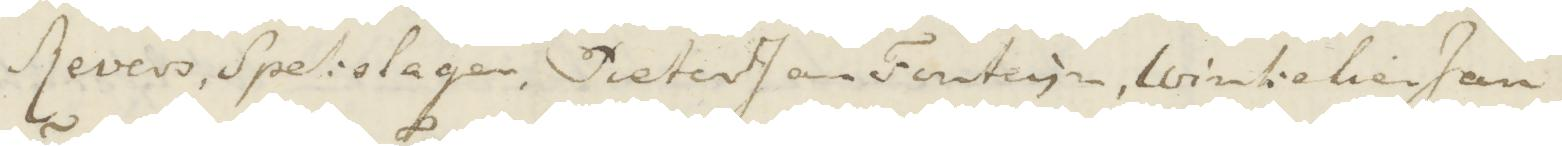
Revers, spekslager, Pieter Jan Fonteijn, winkelier Jan
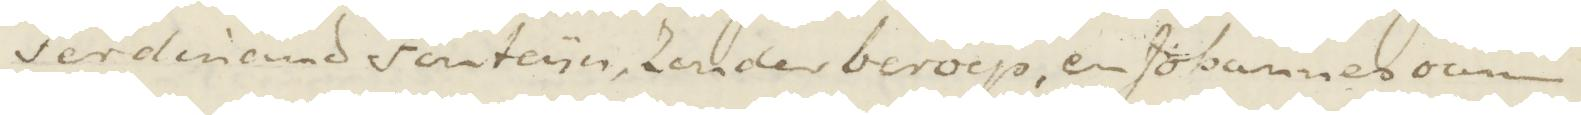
Ferdinand Fonteijn, zonder beroep, en Johannes van
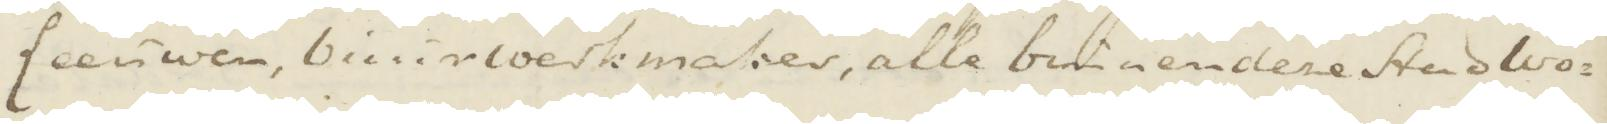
Leeuwen, vuurwerkmaker, alle binnen deze stad wo=
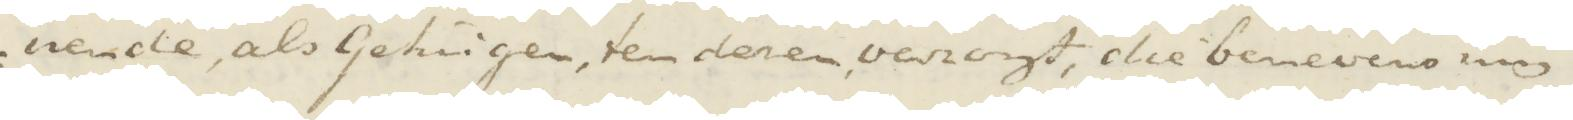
=nende, als Getuigen, ten dezen verzogt, die benevens mij
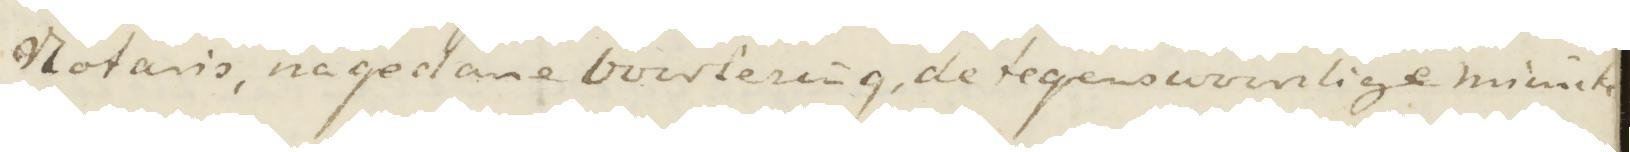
Notaris, na gedane voorlezing, de tegenswoordige minute
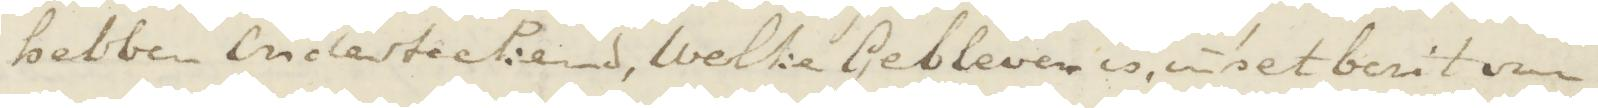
hebben onderteekend, welke Gebleven is, in het bezit van
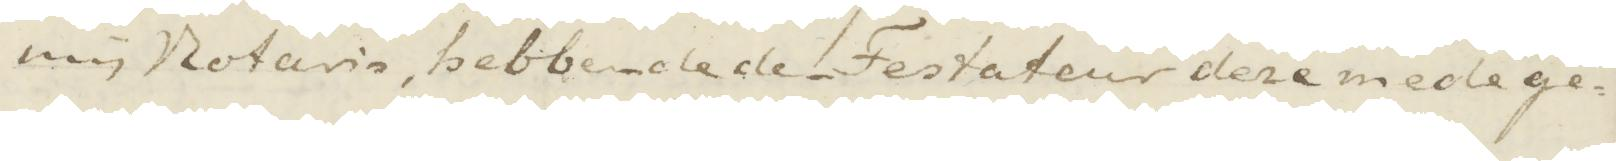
mij Notaris, hebbende de Testateur deze mede ge=
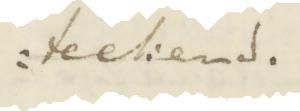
=teekend.
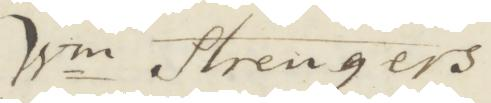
W=m Strengers
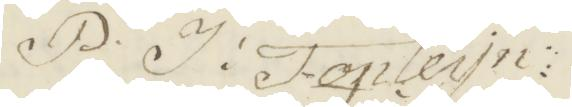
P. J: Fonteijn:
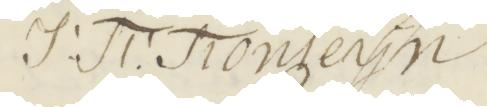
J: F. Fonteijn
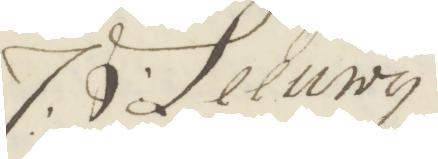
J. v Leeuwen
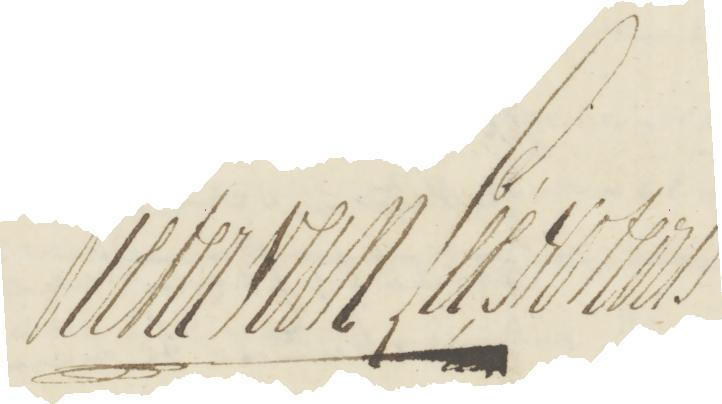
Pieter van Leé notaris
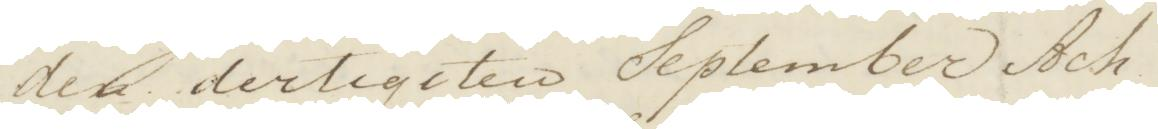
den dertigsten September Ach
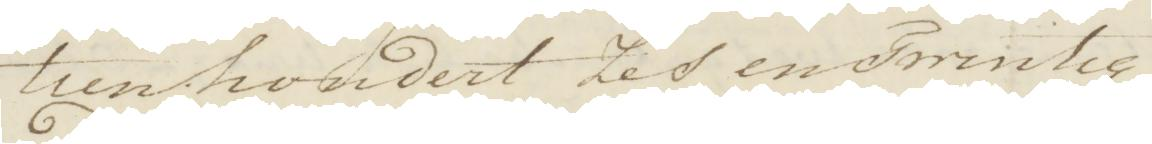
tien hondert zes en Twintig
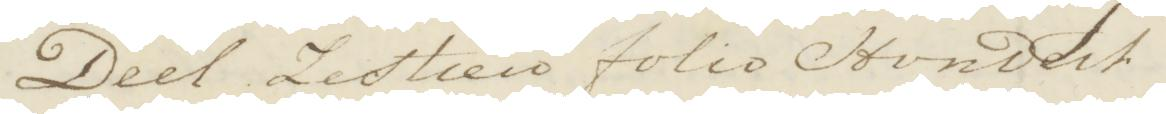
Deel Zestien folio Hondert
